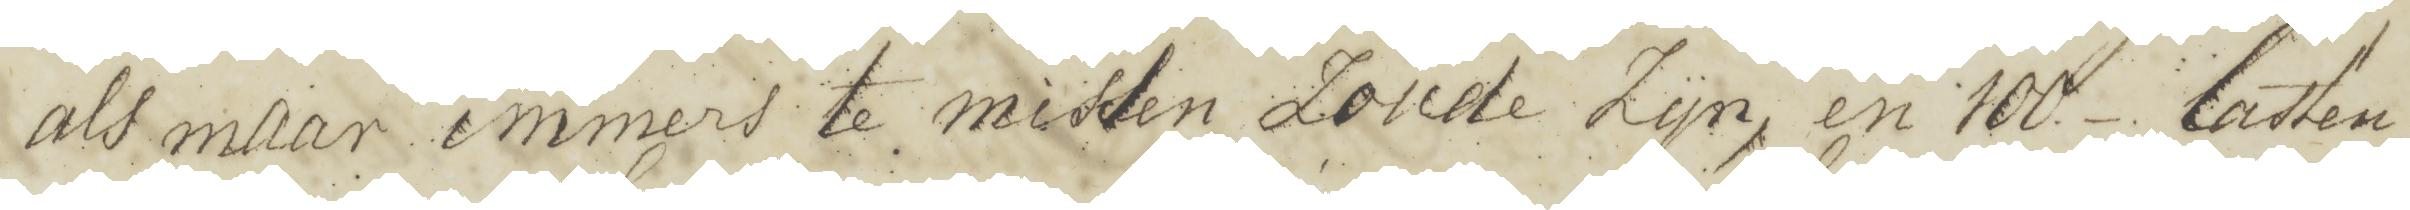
als maar immers te missen zoude zijn, en 100.–. lasten
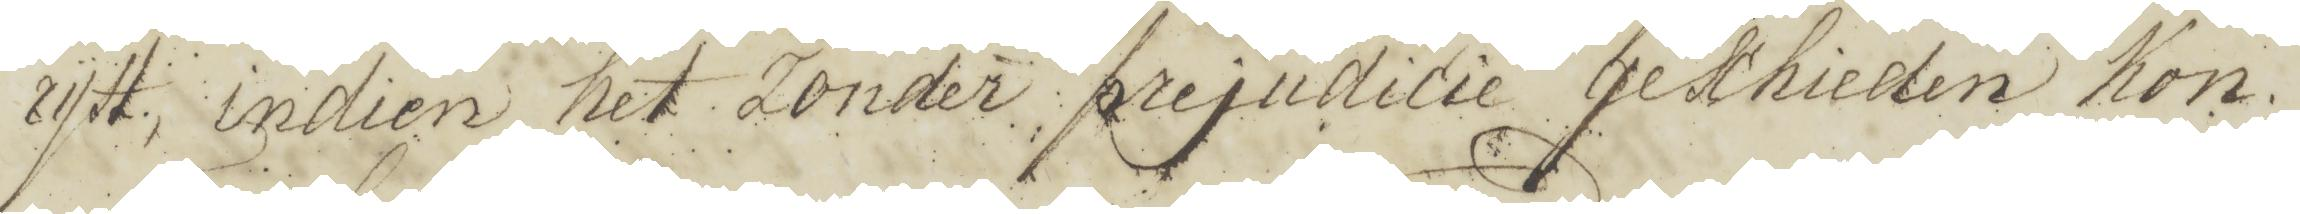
rijst, indien het zonder prejudicie geschieden kon.
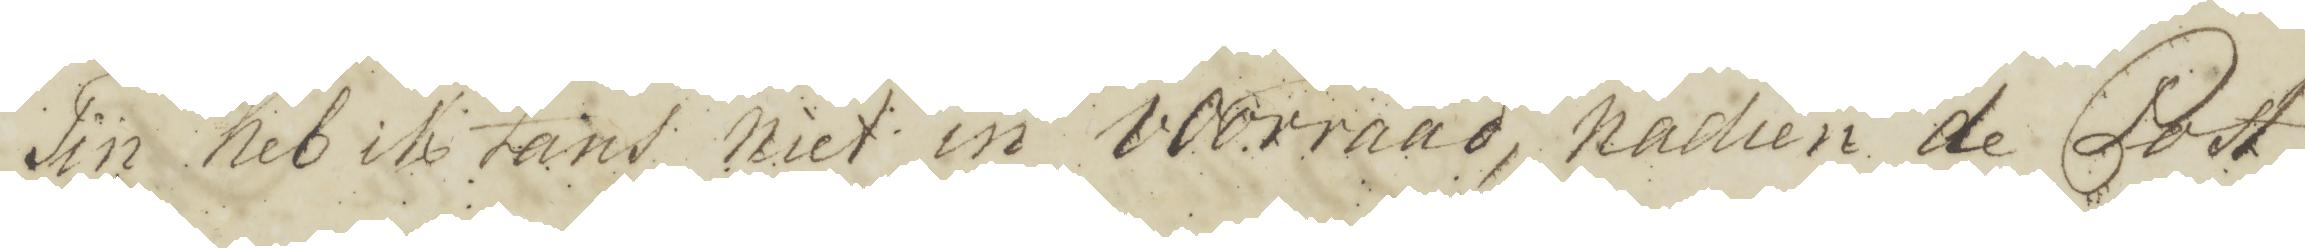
Tin heb ik tans niet in voorraad, nadien de Post
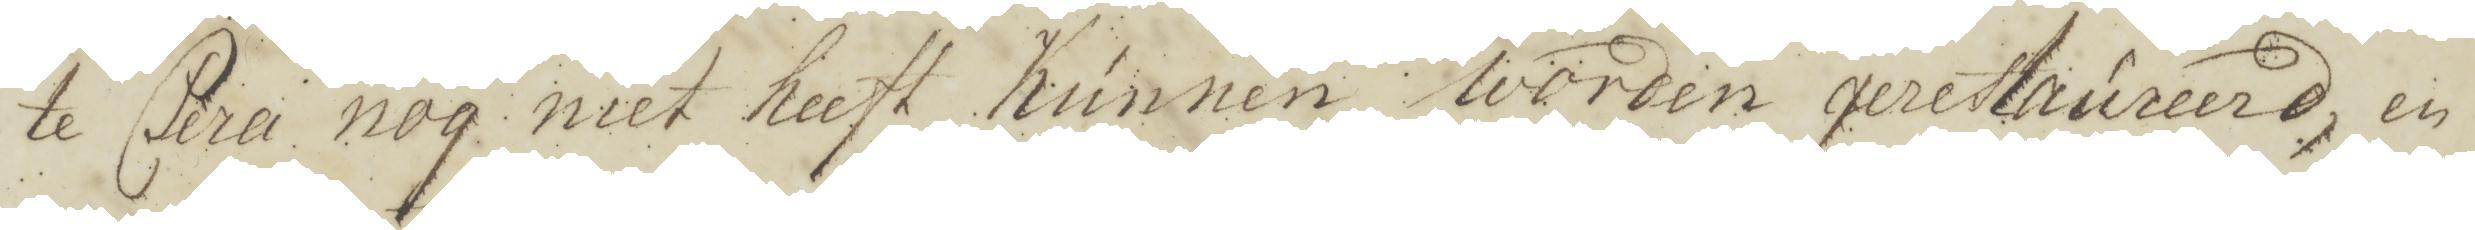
te Pera nog niet heeft kunnen worden gerestaureerd en
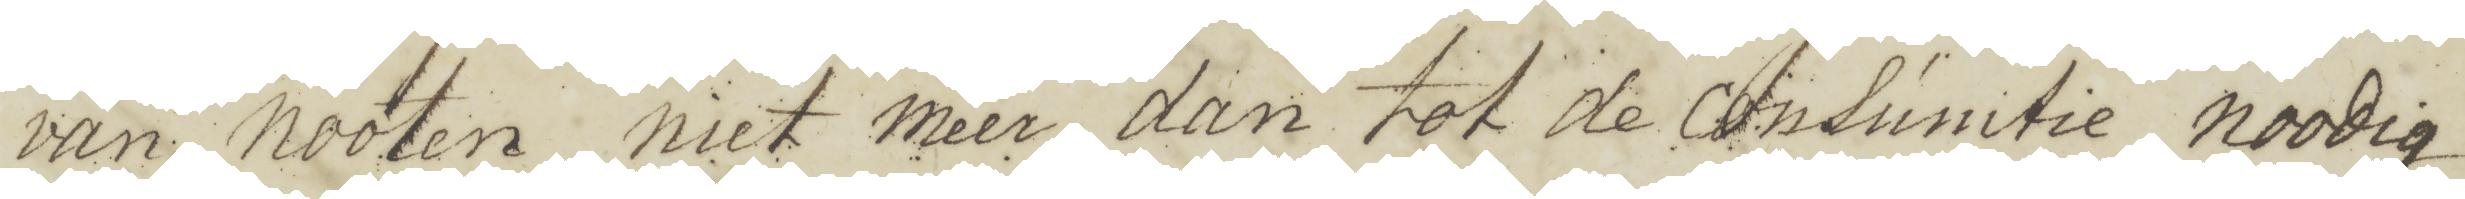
van nooten niet meer, dan tot de consumtie noodig
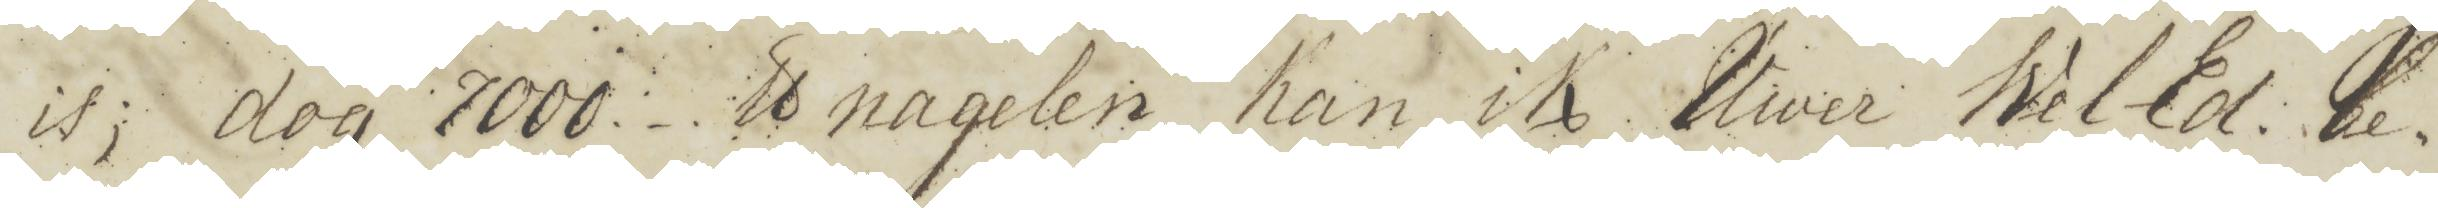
is; dog 7000:–. lb nagelen kan ik Uwer Wel Ed: be„
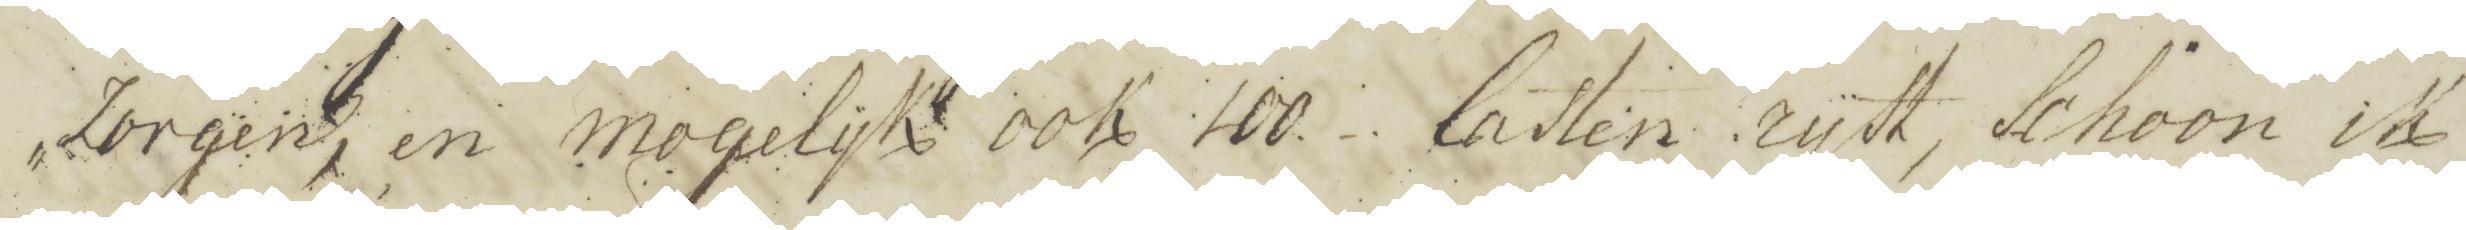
„zorgen, en mogelijk ook 100.–. lasten rijst, schoon ik
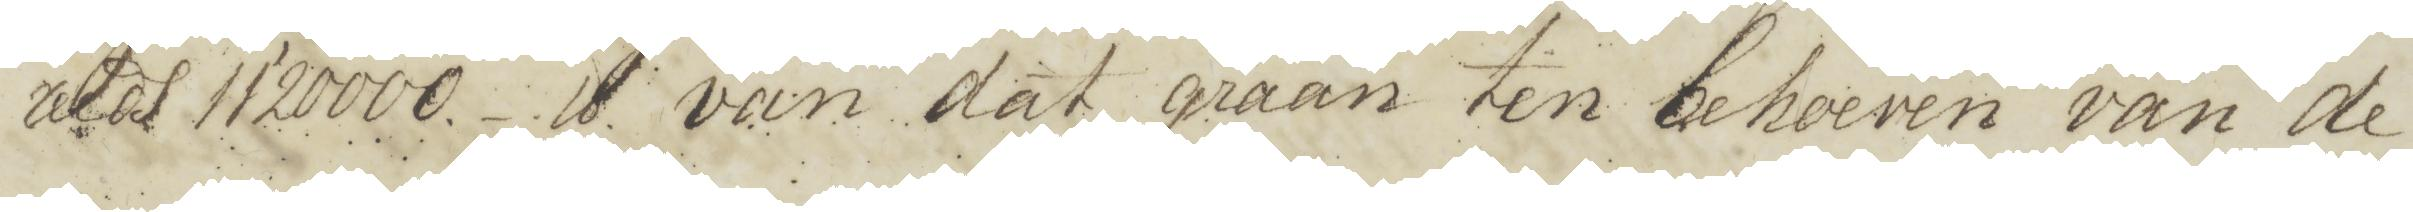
reeds 11'20000.-. lb van dat graan ten behoeven van de
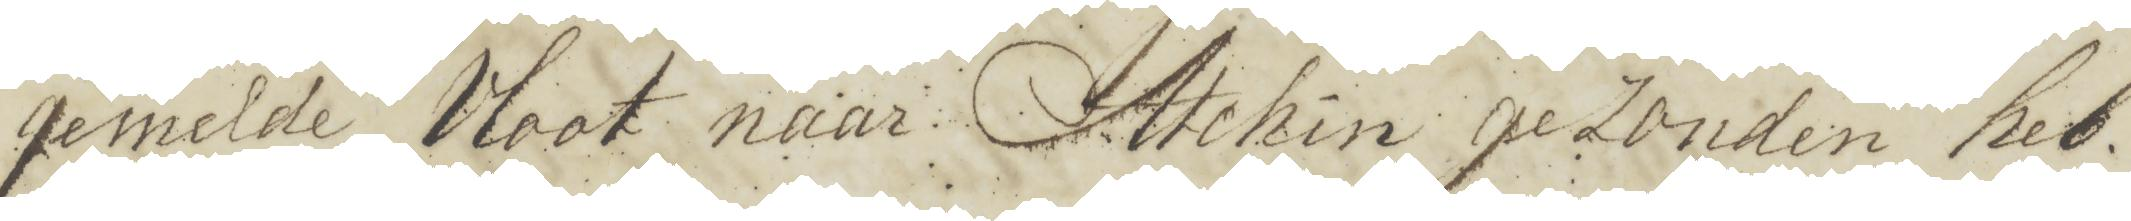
gemelde Vloot naar: Atchin gezonden heb.
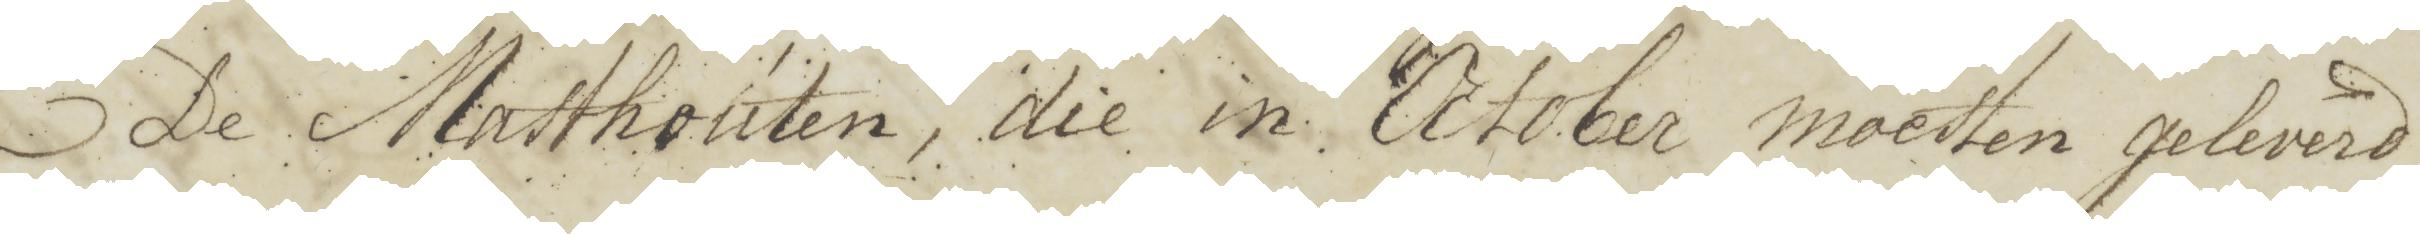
De Masthouten, die in October moesten geleverd
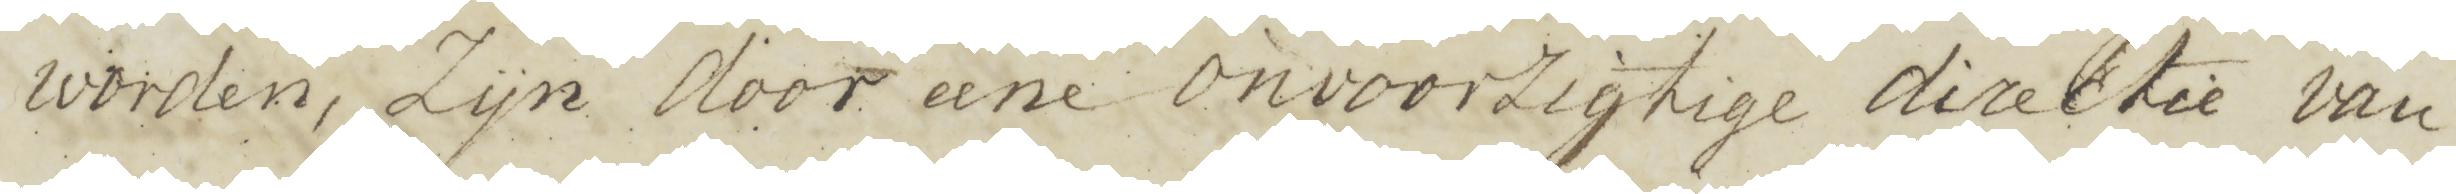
worden, zijn door eene onvoorzigtige directie van
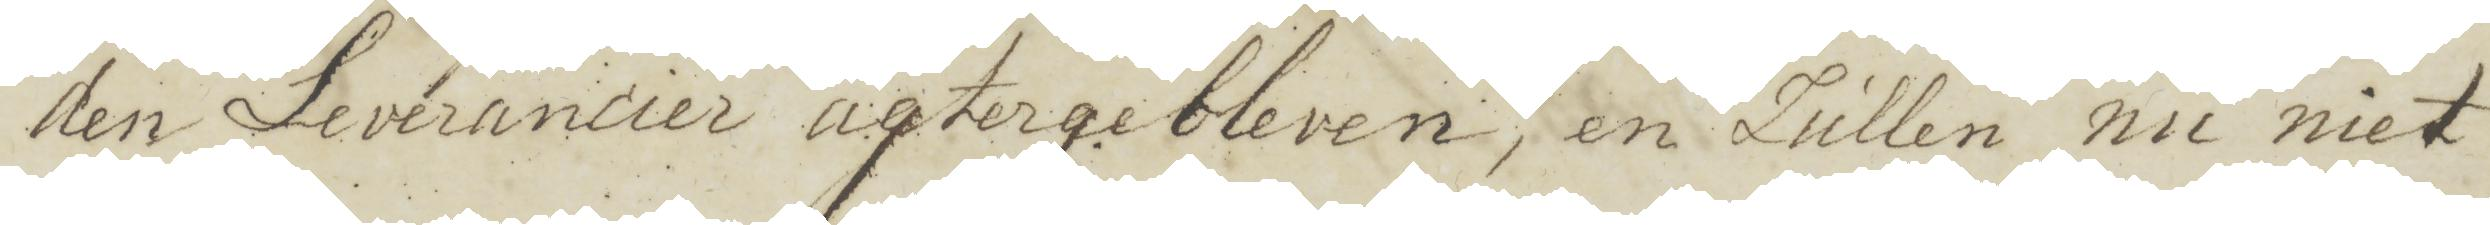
den Leverancier agtergebleven, en zullen nu niet
